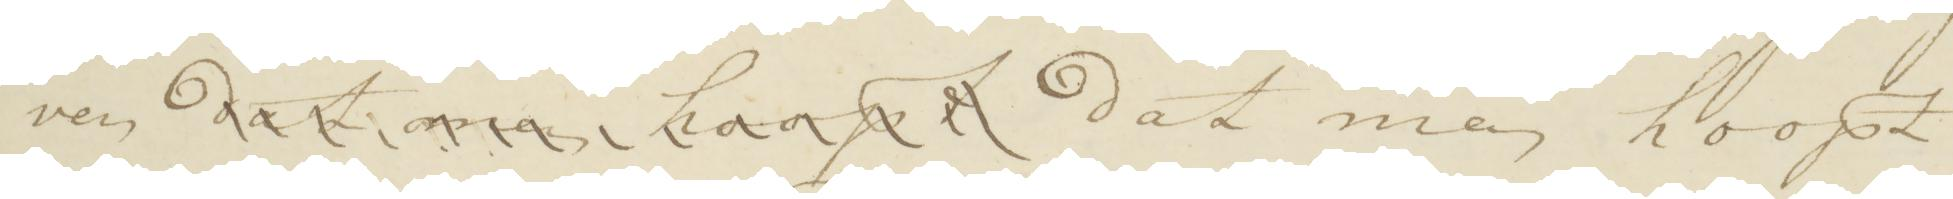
ven dat men hoopt dat men hoopt
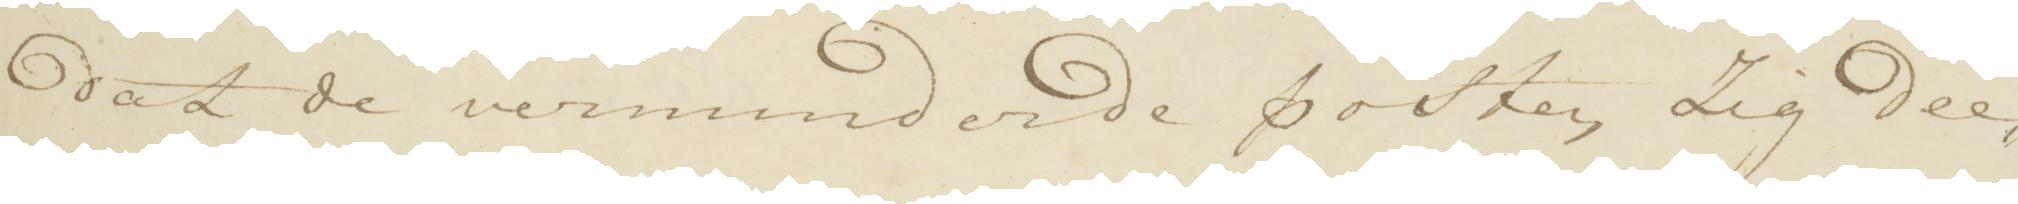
dat de verminderde posten zig dee„
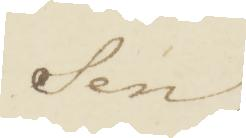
sen
